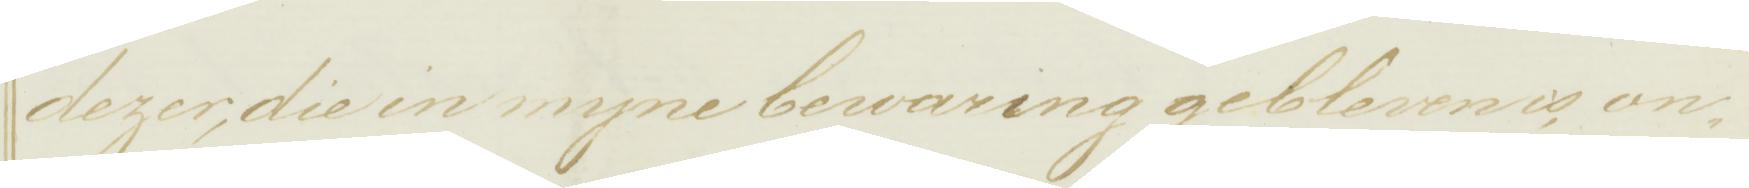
dezer, die in myne bewaring gebleven is on„
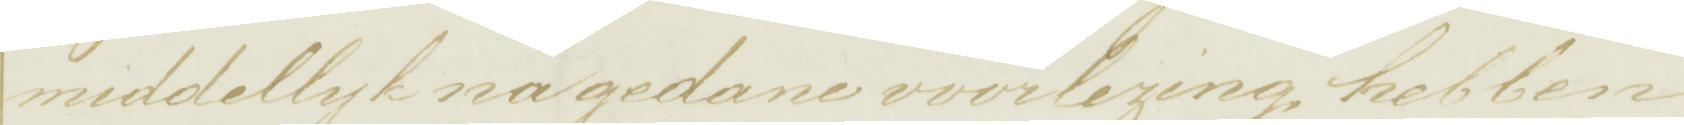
middellyk na gedane voorlezing hebben
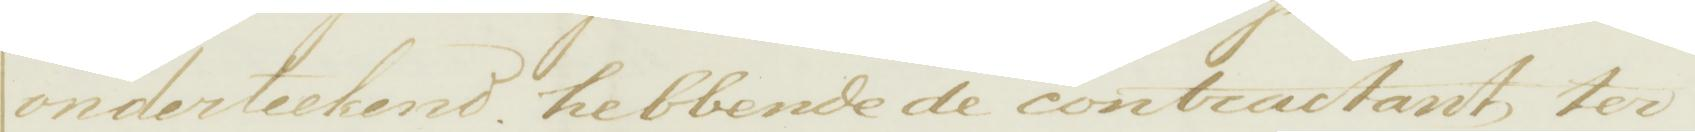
onderteekend. hebbende de contractant ter
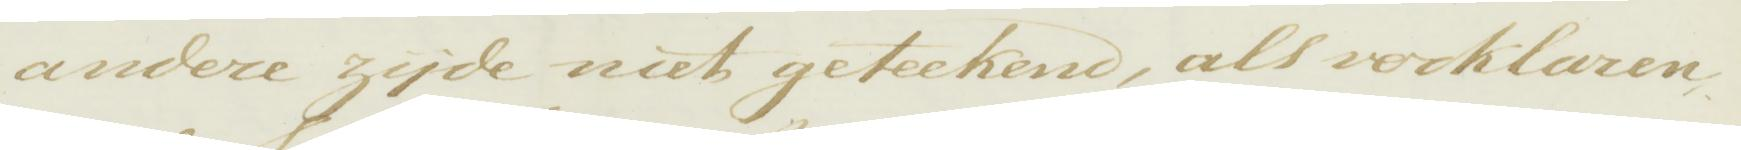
andere zijde niet geteekend, als verklaren,
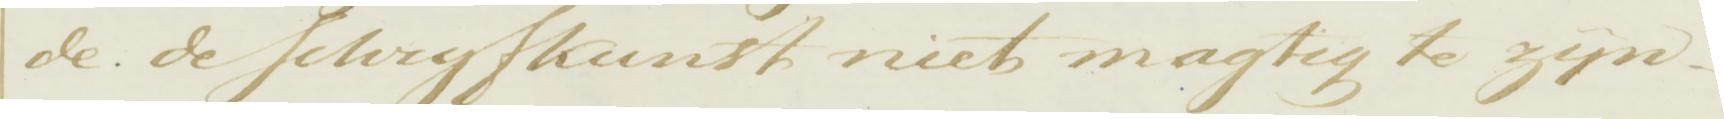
de. de schryfkunst niet magtig te zijn-
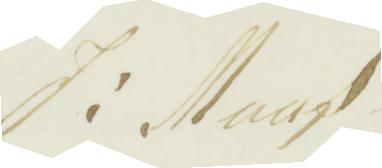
I: Maagt
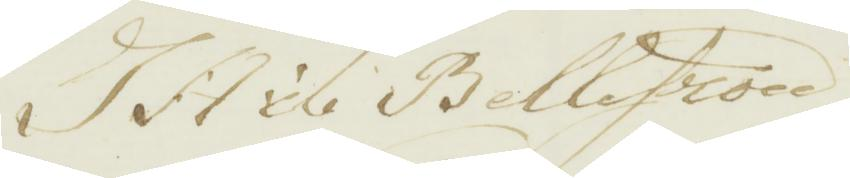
I H de Bellefroid
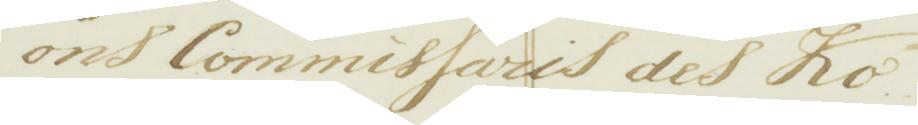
ons Commissaris des Ko.
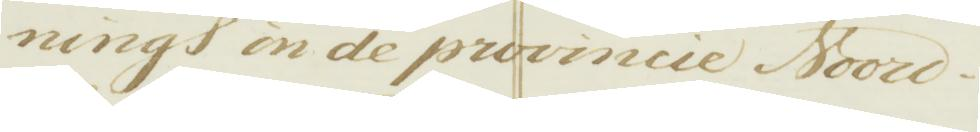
nings in de provincie Noord-
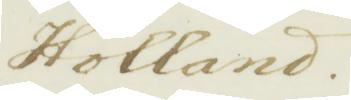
Holland.
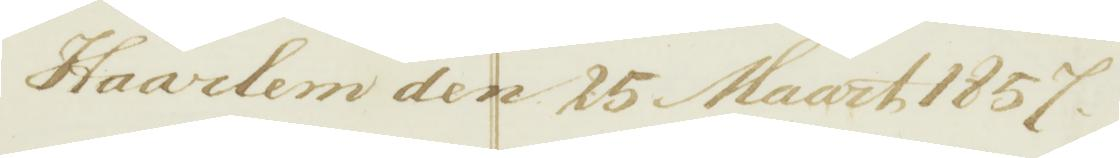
Haarlem den 25 Maart 1857.
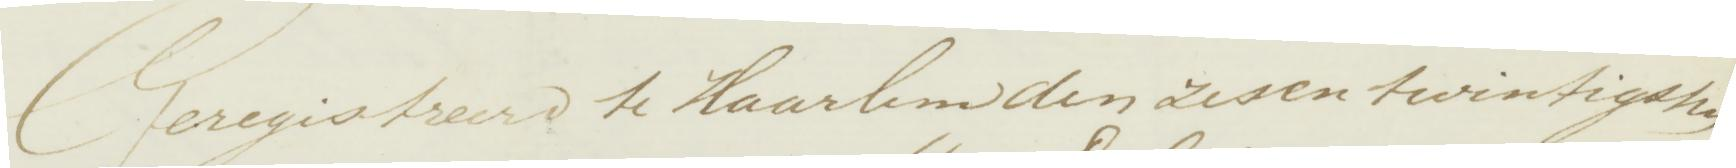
Geregistreerd te Haarlem den zes en twintigsten
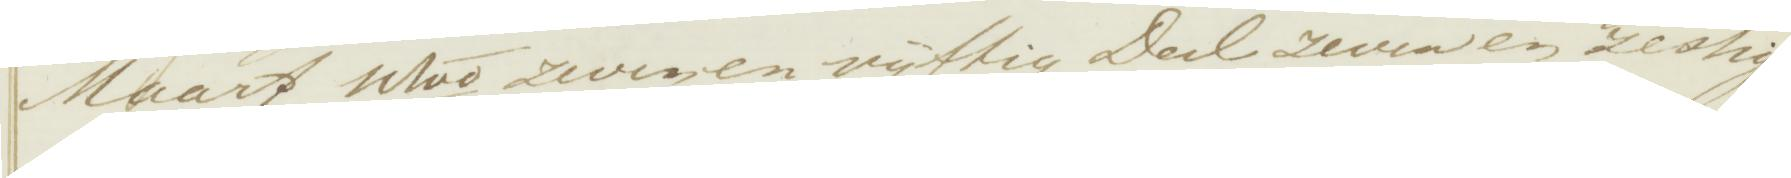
Maart 1800 zeven en vijftig Deel zeven en zestig
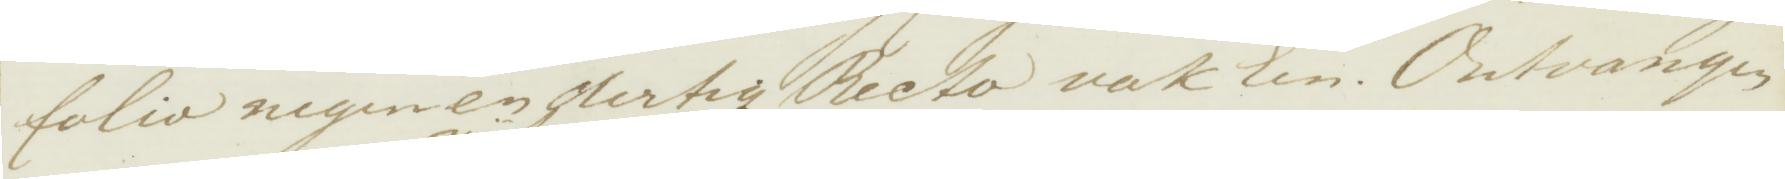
folio negen en dertig Recto vak Een. Ontvangen
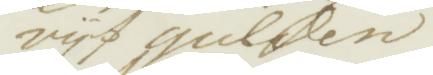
vijf gulden
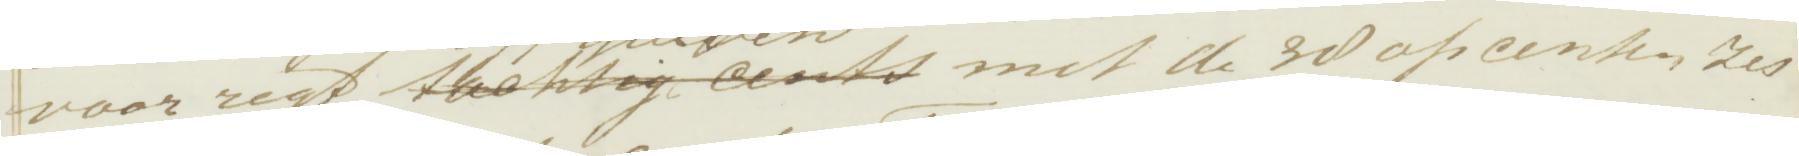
voor regt tachtig cents met de 38 opcenten zes
